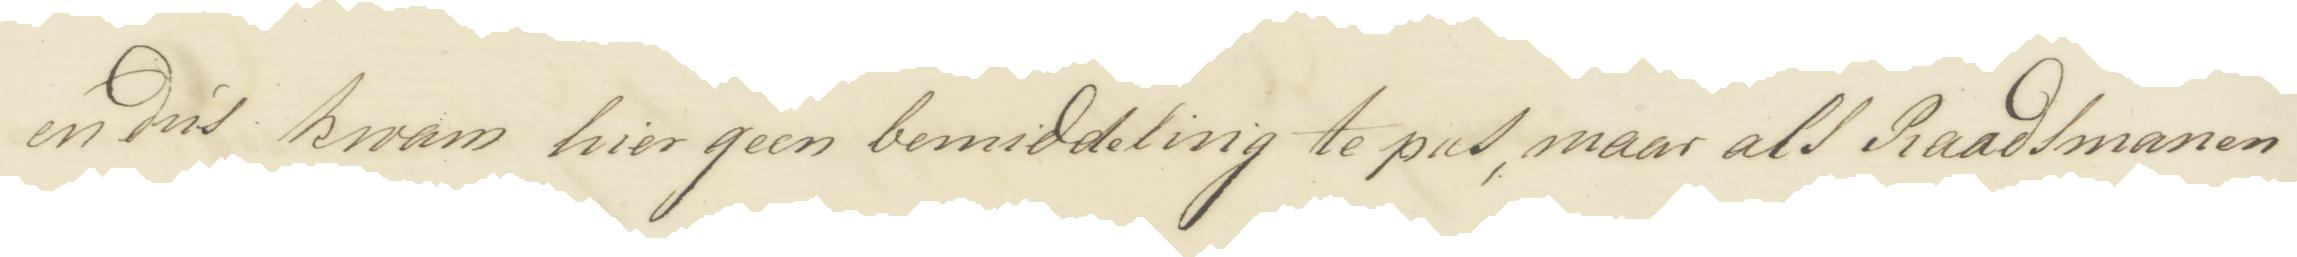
en dus kwam hier geen bemiddeling te pas, maar als Raadsmanen
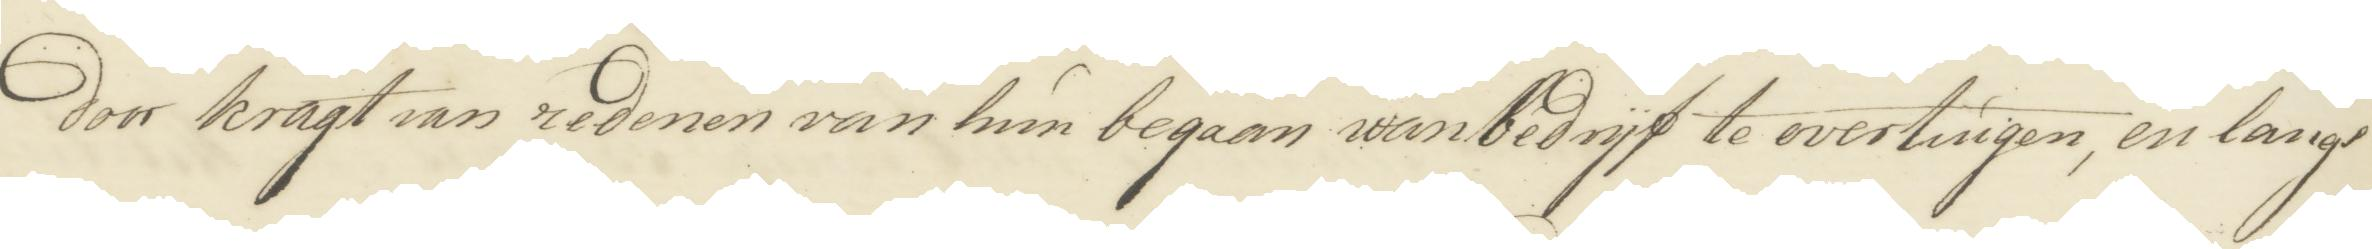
door kragt van redenen van hun begaan wanbedrijf te overtuigen, en langs
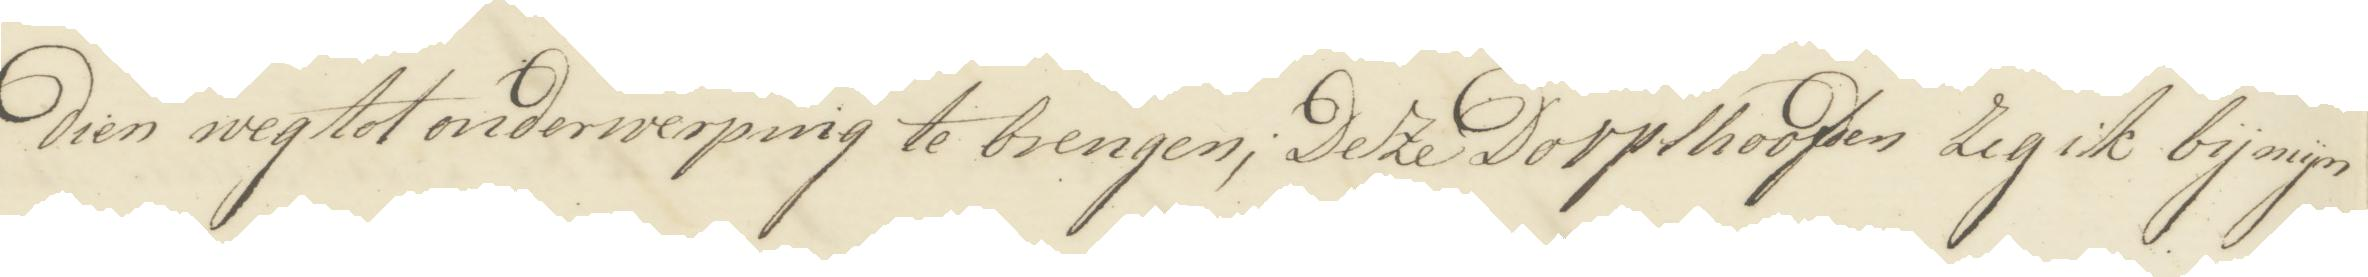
dien weg tot onderwerping te brengen; Deze Doopshoofden zig ik bij mijn
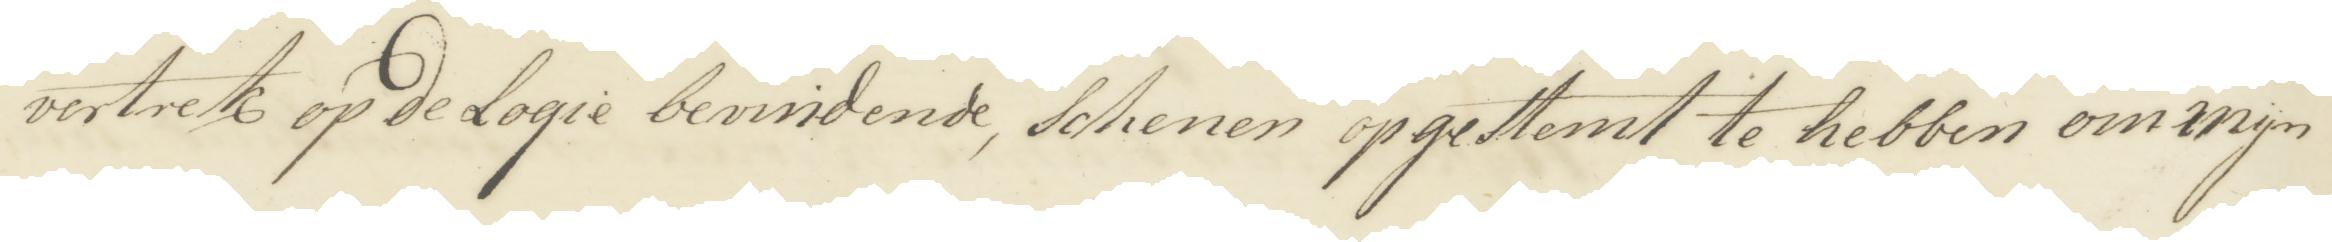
vertrek op de Logie bevindende, schenen opgestemt te hebben om mijn
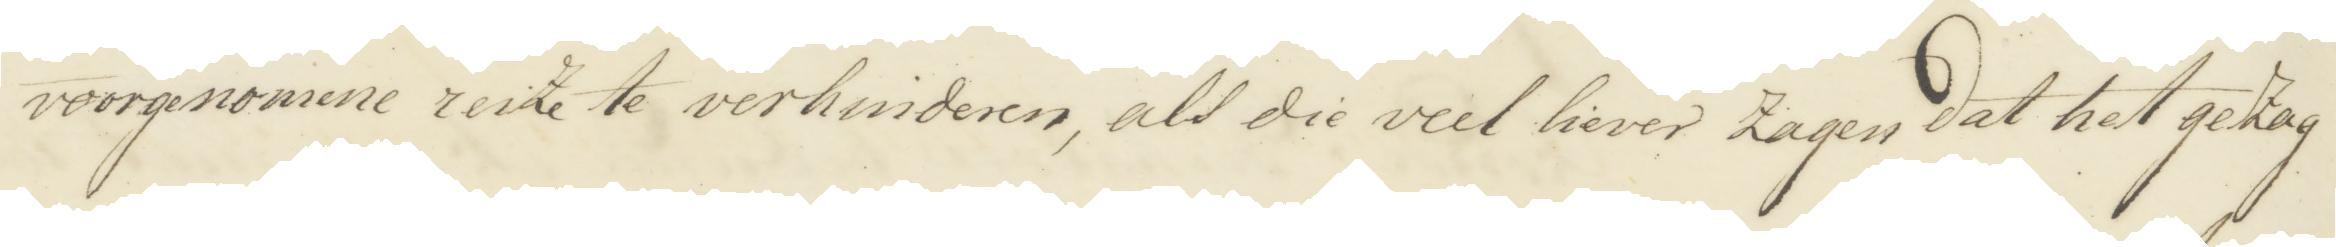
voorgenomene reize te verhinderen, als die veel liever zagen dat het gezag
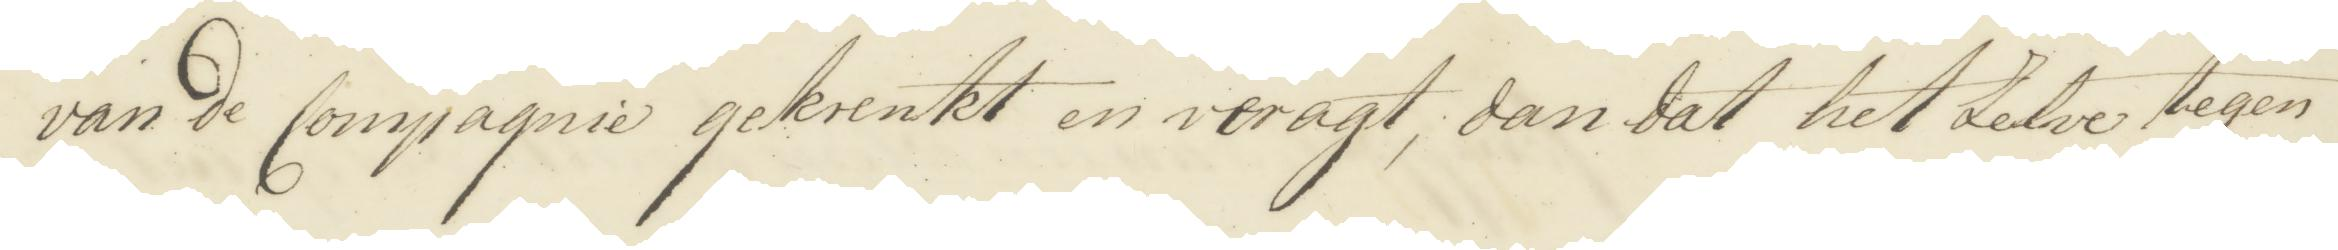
van de Compagnie gekrenkt en veragt, dan dat het zelve tegen
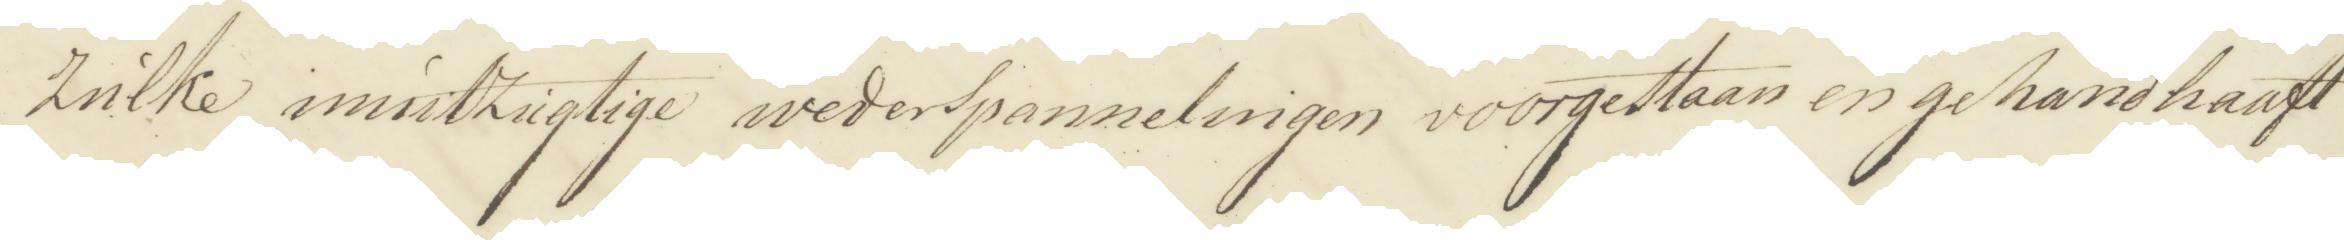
zulke muitzugtige wederspannelingen voorgestaan en gehandhaaft
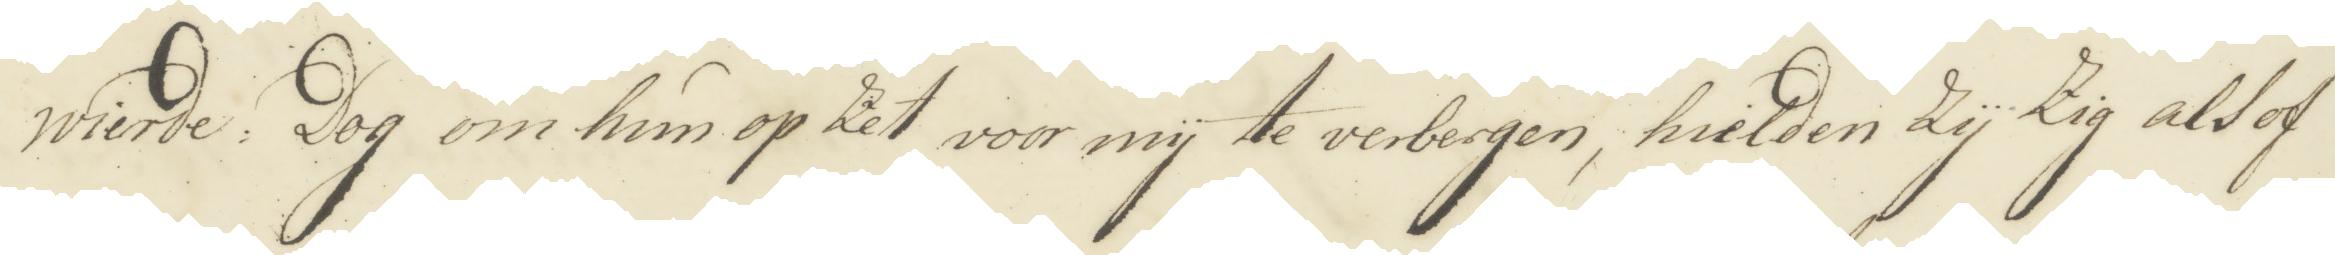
wierde; Dog om hun op zet voor mij te verbergen, hielden zij zig als of
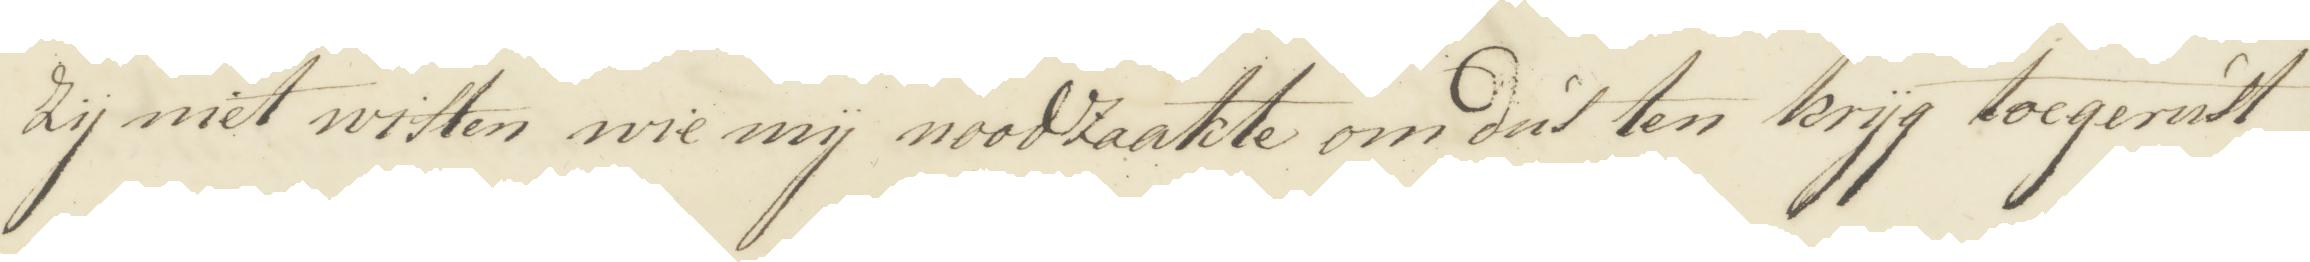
zij niet wisten wie mij noodzaakte om dus ten krijg toegerust,
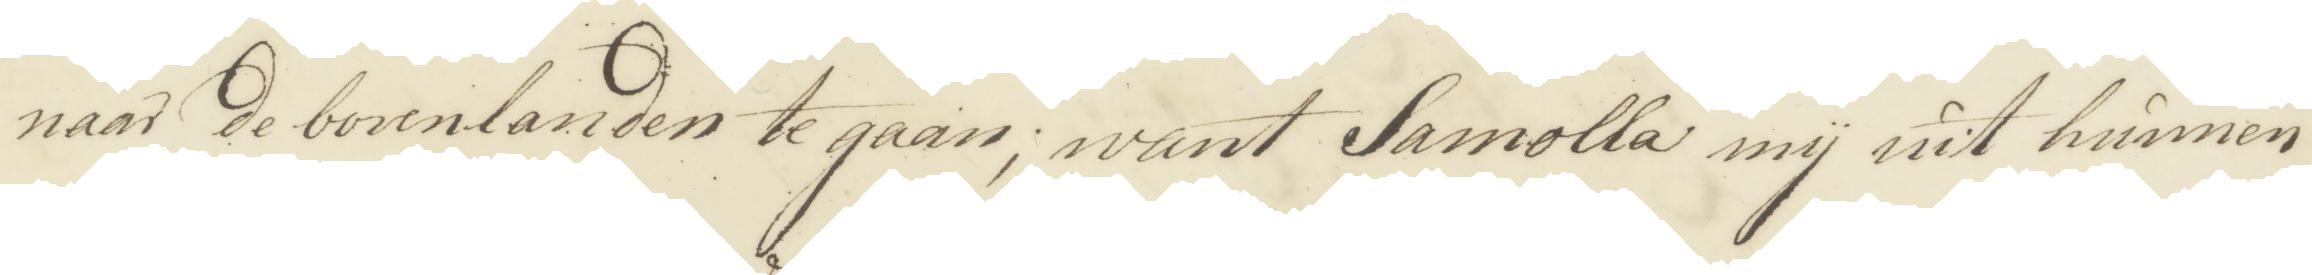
naar de bovenlanden te gaan; want Samolla mij uit hunnen
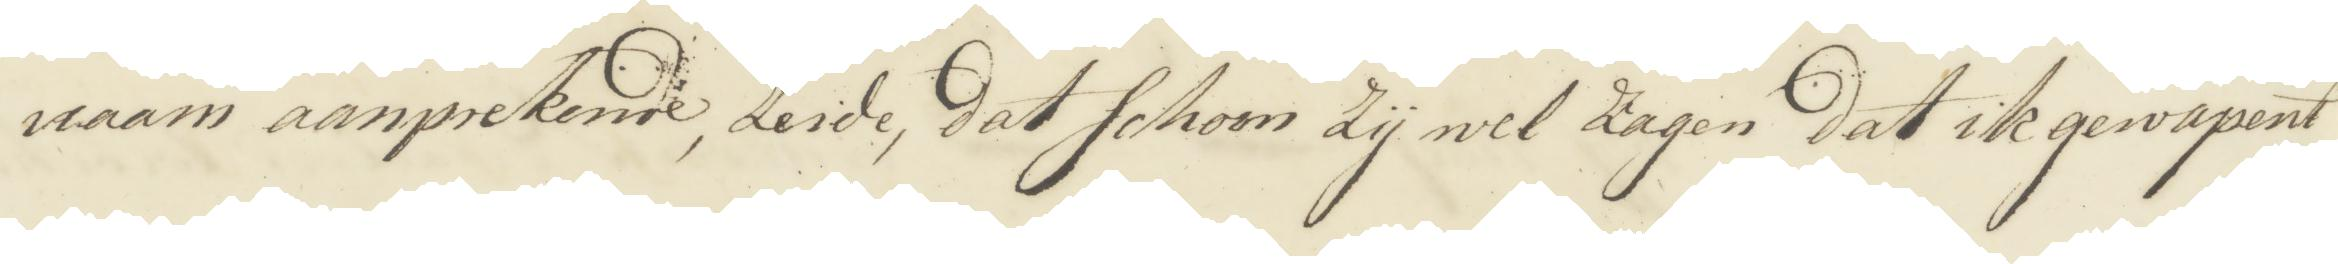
naam aanprekende, zeide, dat schoon zij wel zagen dat ik gewapent
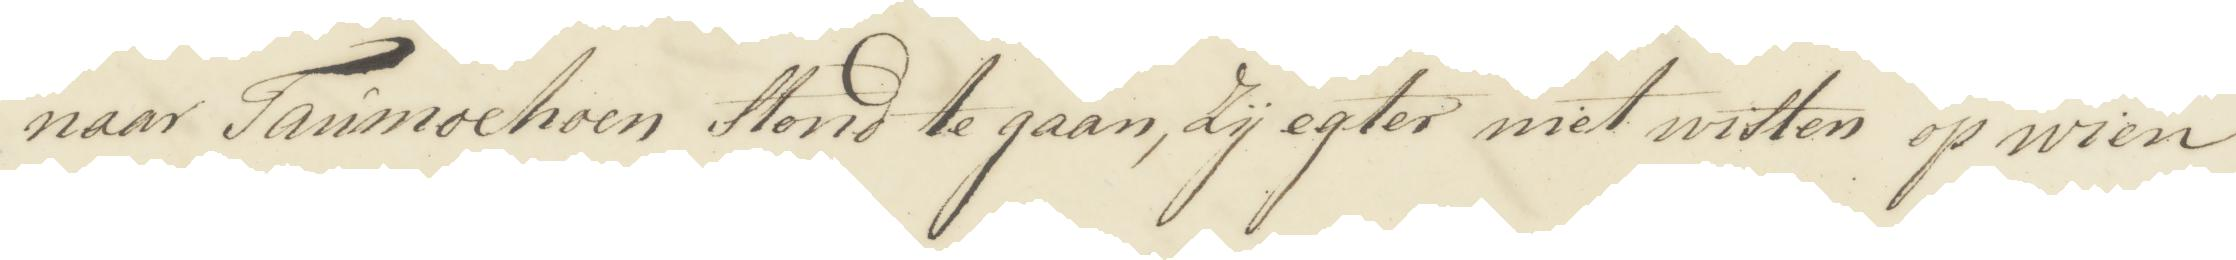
naar Taumoehoen stond te gaan, zij egter niet wisten op wien
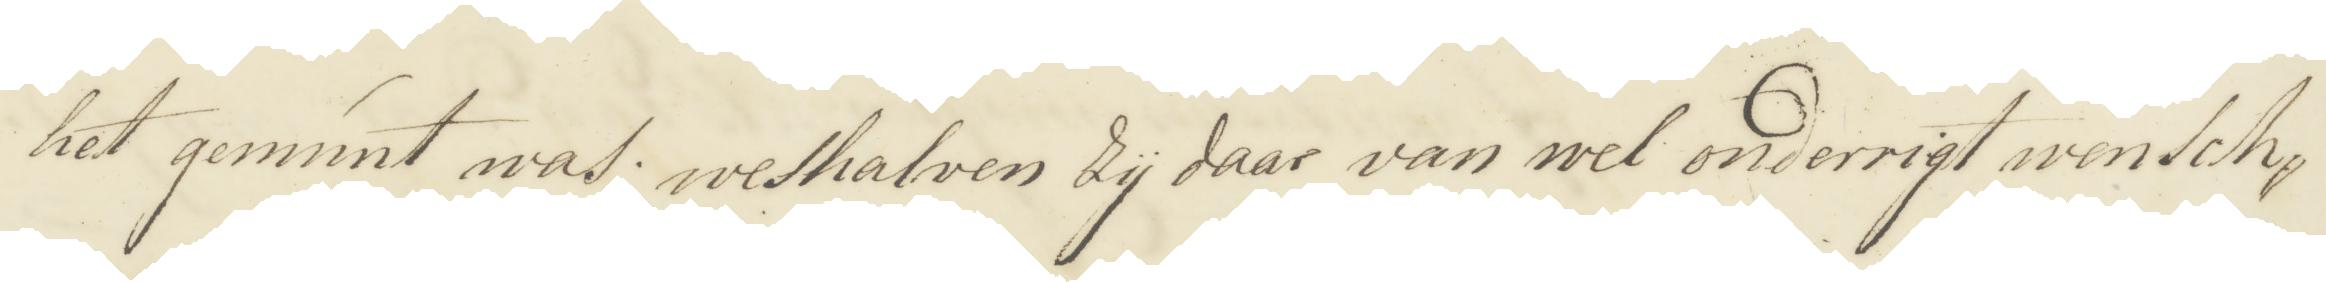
het gemunt was; weshalven zij daar van wel onderrigt wensch
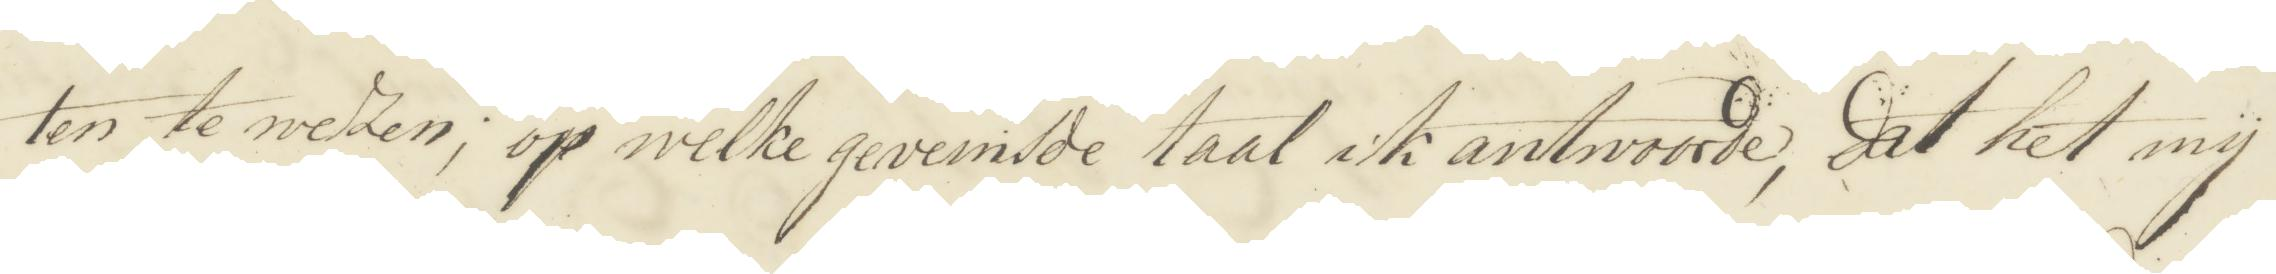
ten te wezen; op welke geveinsde taal ik antwoorde, dat het mij
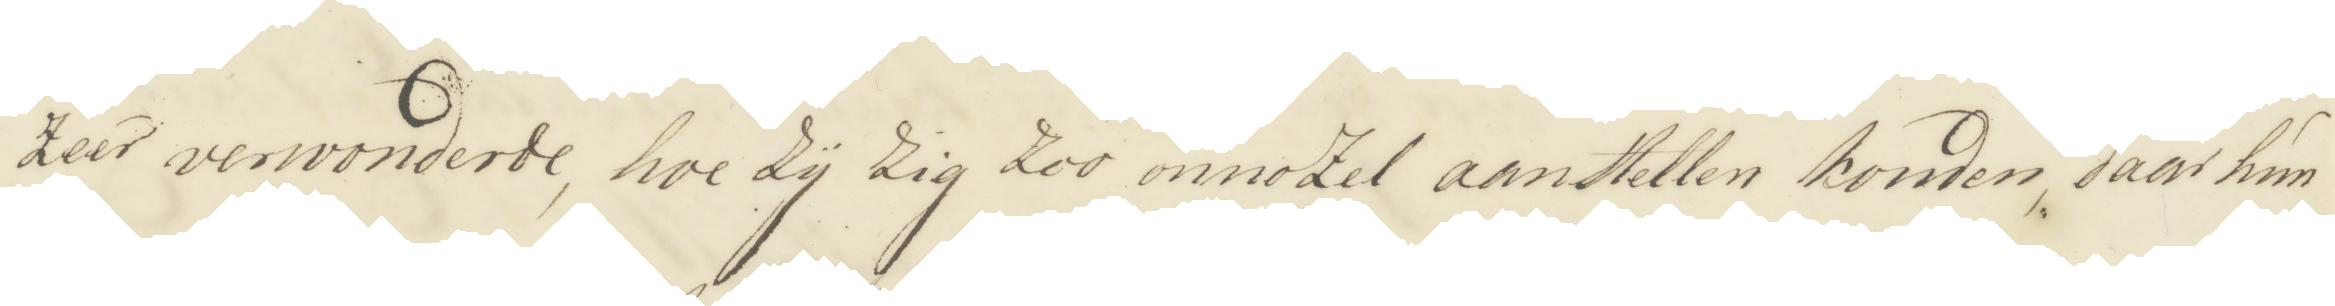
zeer verwonderde, hoe zij zig zoo onnozel aanstellen konden, daar hun
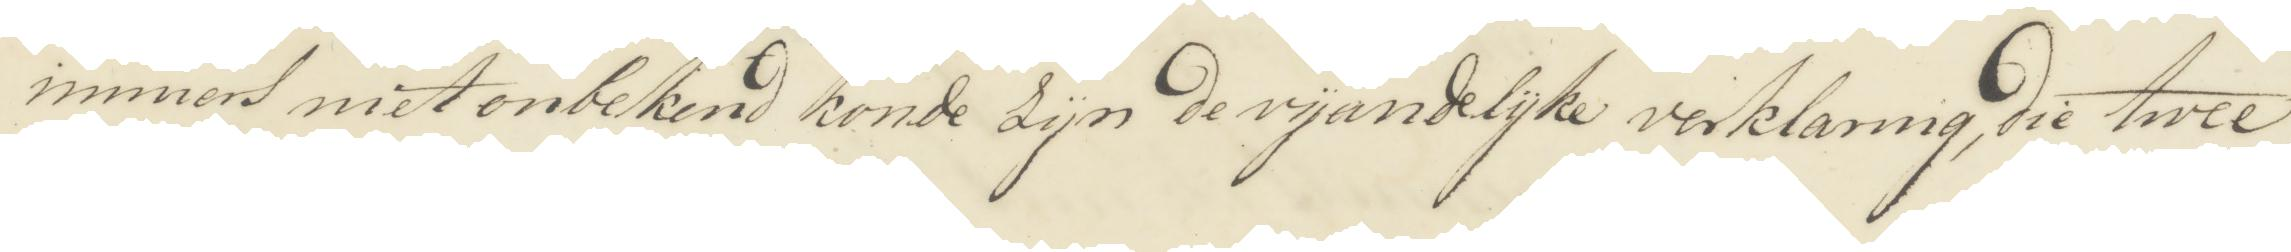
immers niet onbekend konde zijn de vijandelijke verklaring, die twee
